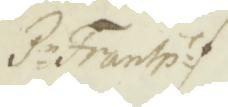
P=r Transp=t ƒ
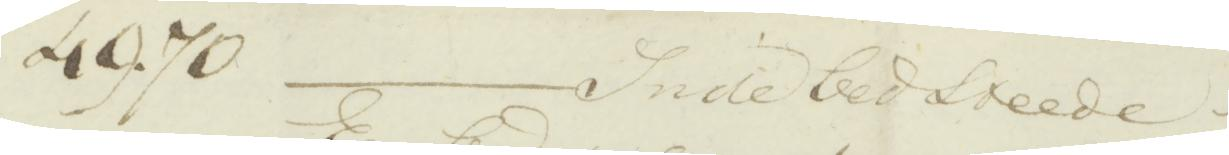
49.70 — In de bedsteede
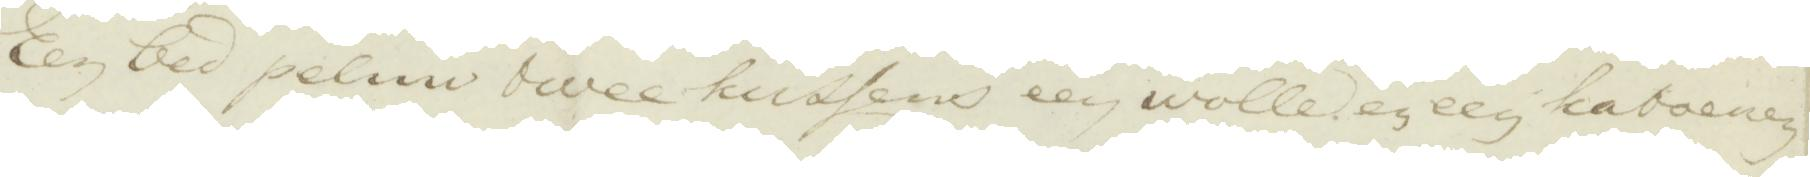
Een bed peluw twee kussens een wolle en een katoenen
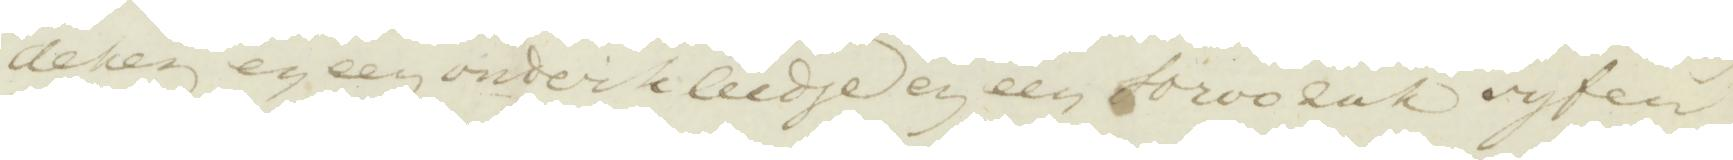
deken en een onderkleedje en een stroo zak vyfen
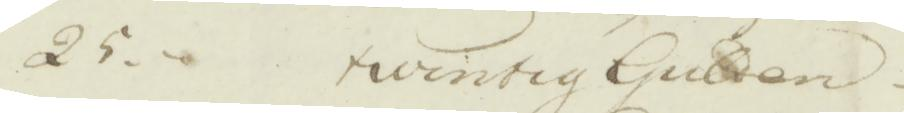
25. - twintig Gulden
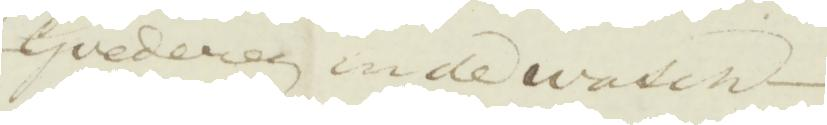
Goederen in de wasch-
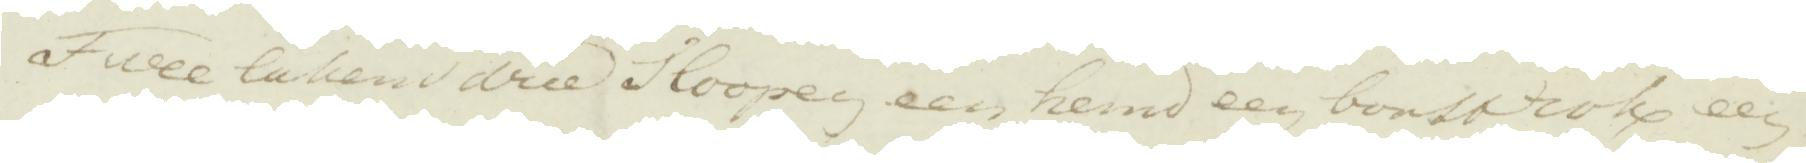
Twee lakens drie sloopen een hemd een borstrok een
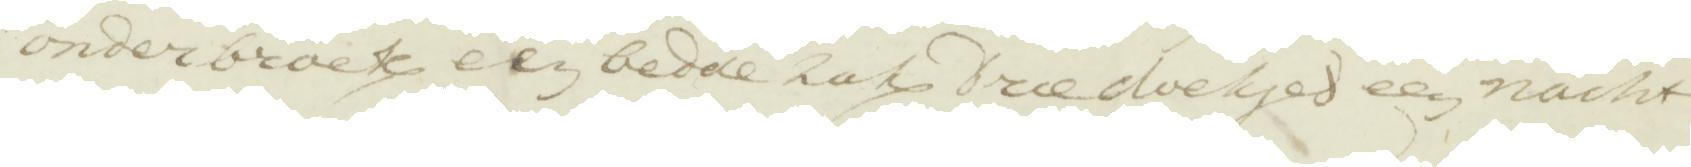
onderbroek een bedde zak drie doekjes een nacht
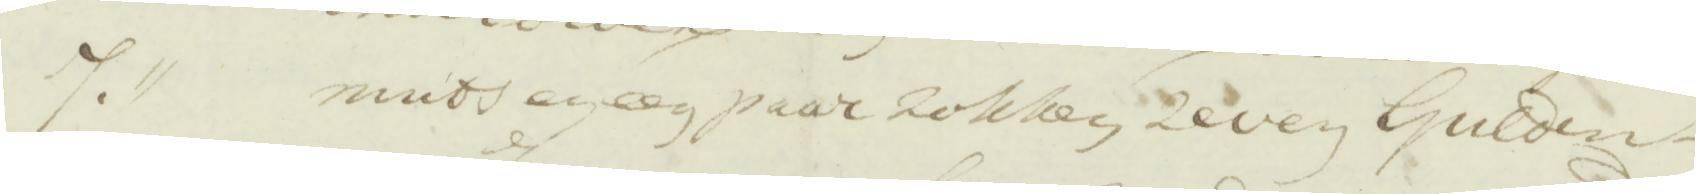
7.„ muts en een paar zokken zeven Gulden.
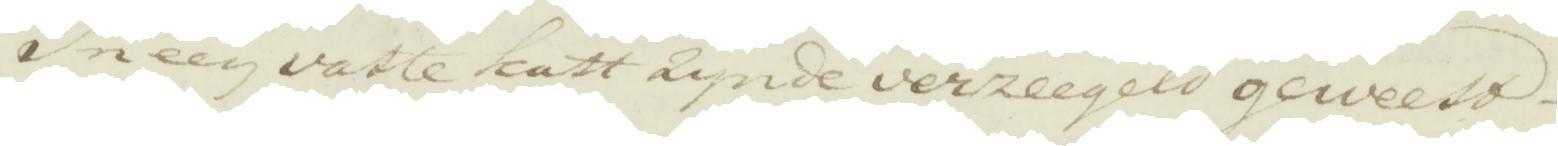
In een vaste kast zynde verzeegeld geweest
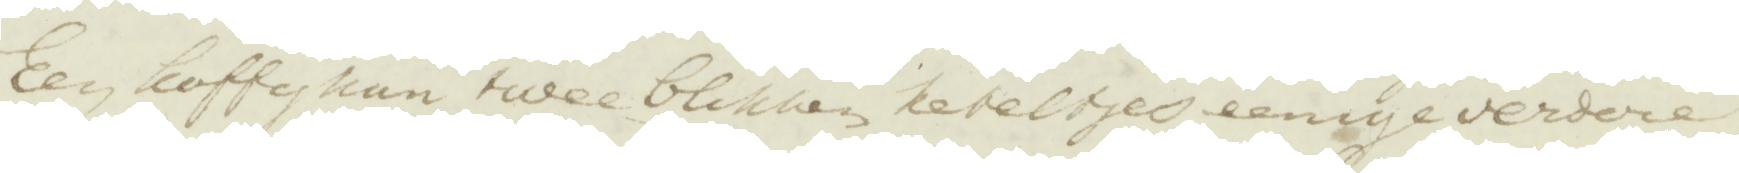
Een koffykan twee blikken keteltjes eenige verdere
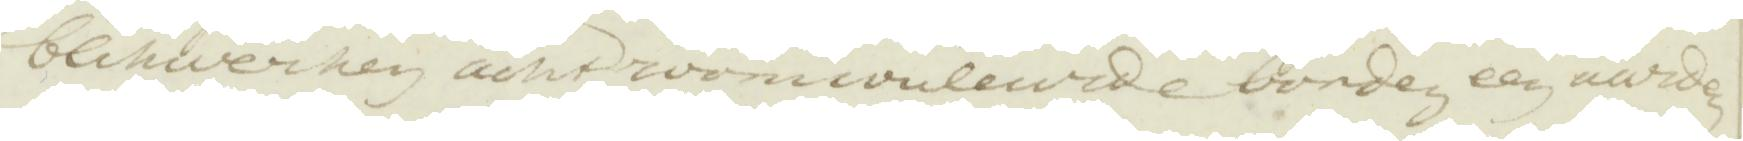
blikwerken acht roomcouleurde borden een aarden
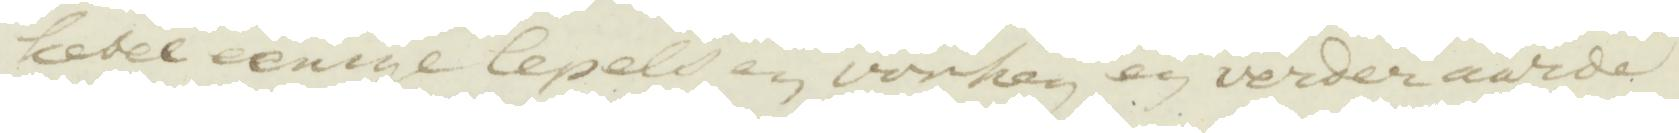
ketel eenige lepels en vorken en verder aarde
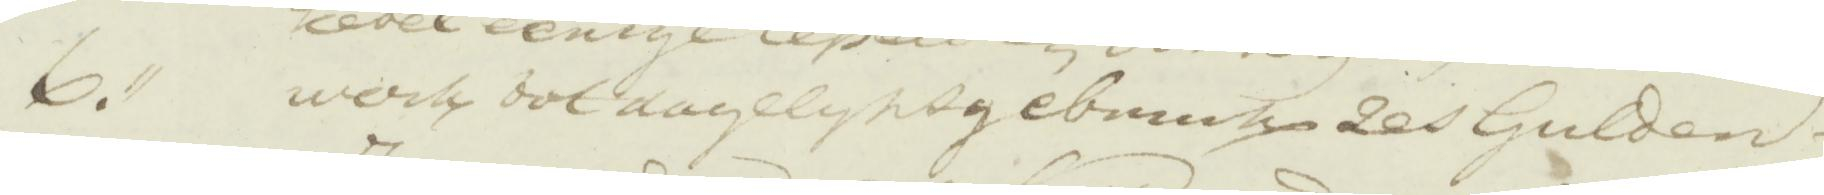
6.„ werk tot dagelyksgebruik zes Gulden
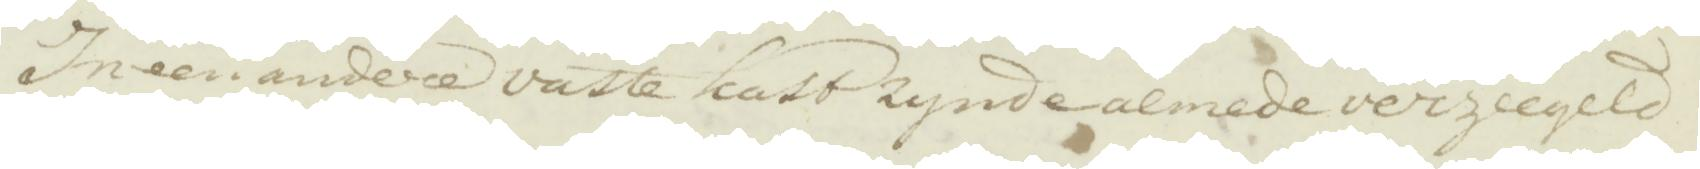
In een andere vaste kast zynde almede verzeegeld
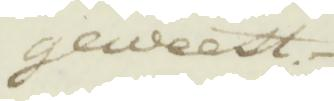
geweest.-
